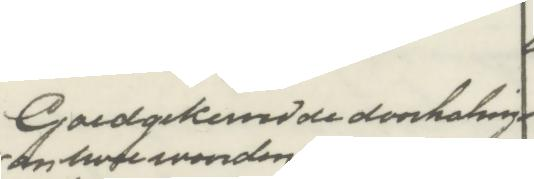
Goedgekeurd de doorhaling
